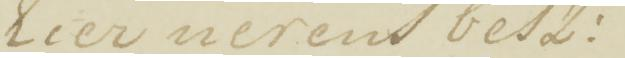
hier nevens besz:
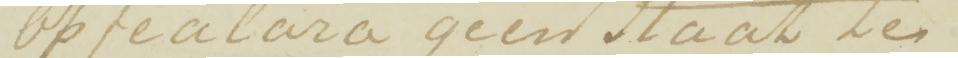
op Fealara geen staat te
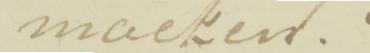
maeken.
